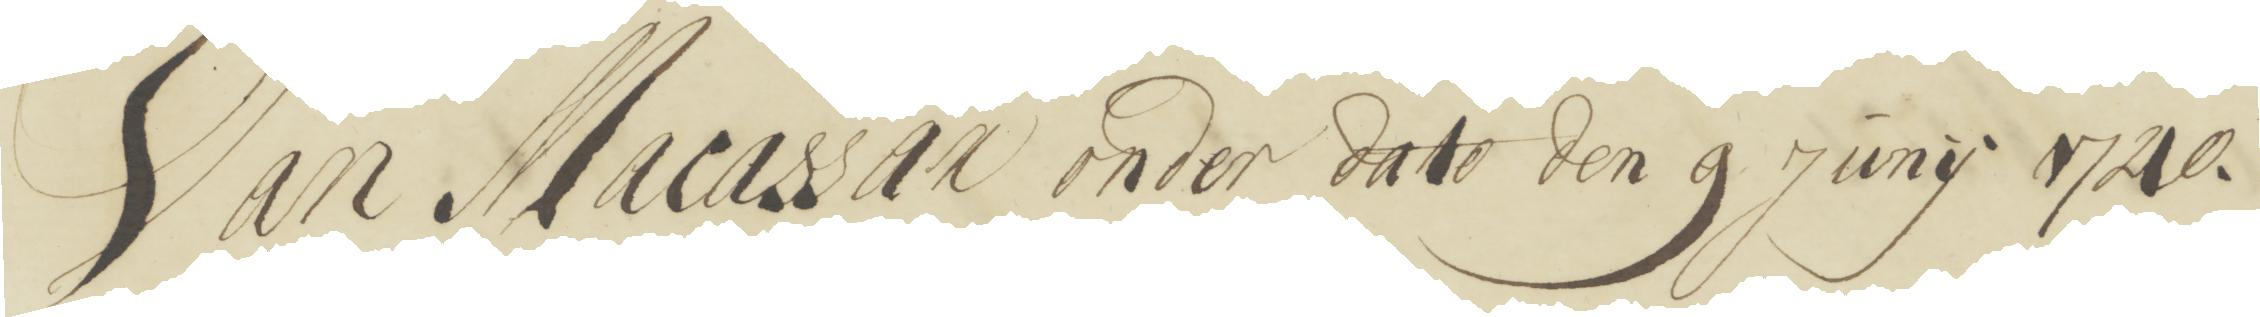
Van Macassar onder dato den 9 Junij 1740.
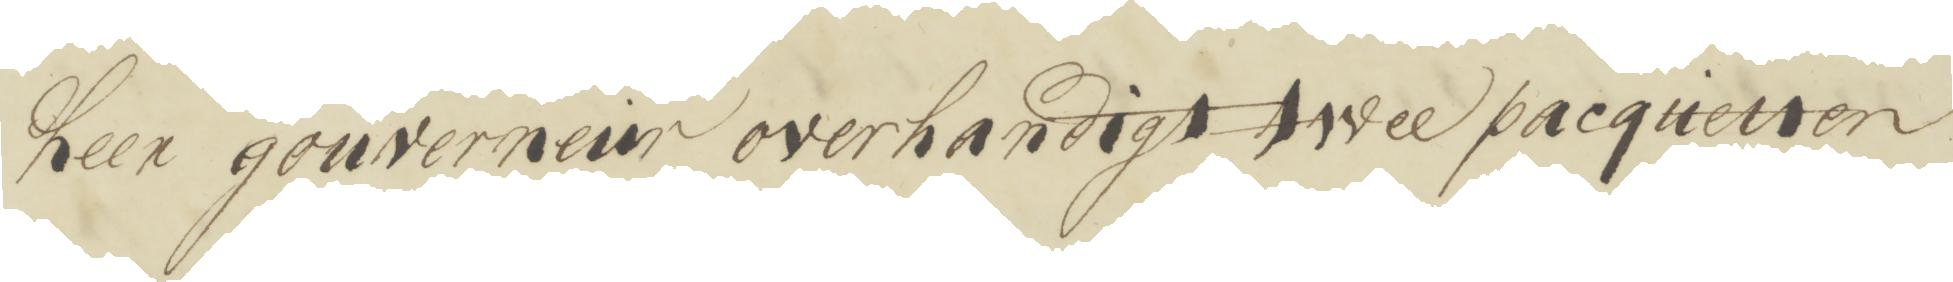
heer gouverneur overhandigt twee pacquetten
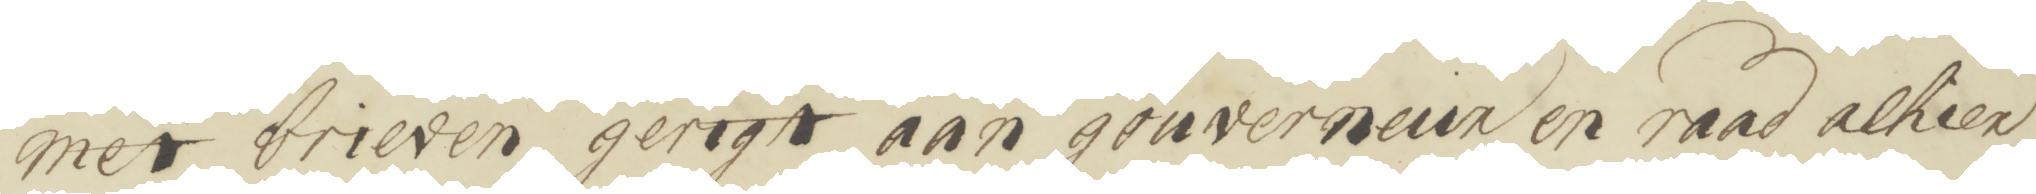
met brieven, gerigt aan gouverneur en raad alhier,
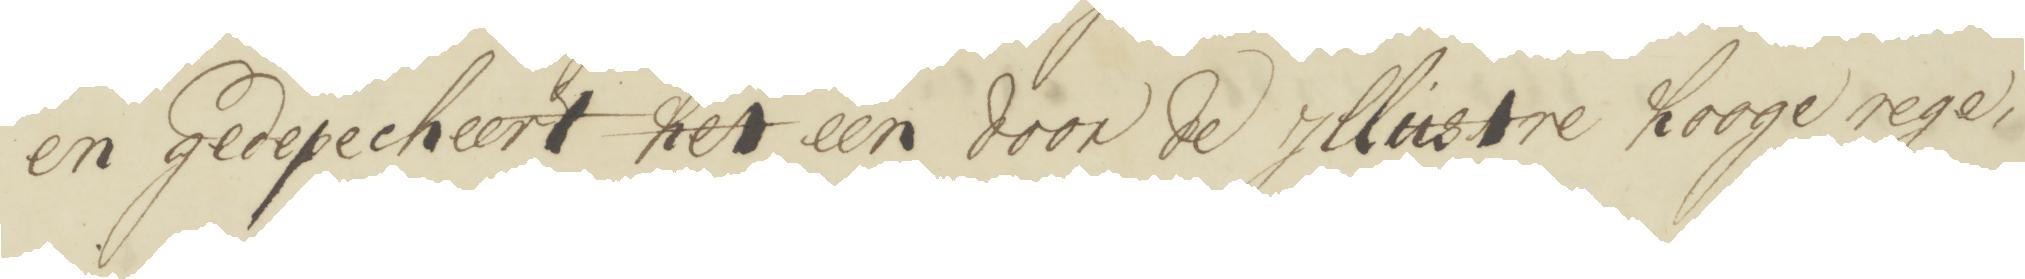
en gedepecheert het een door de Jllustre hooge rege„
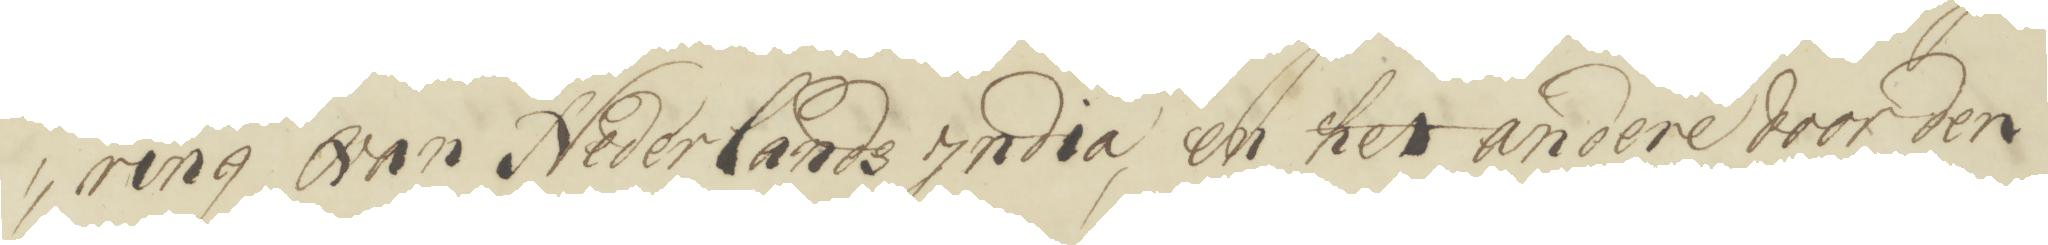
„ring van Nederlands Jndia, en het andere door den
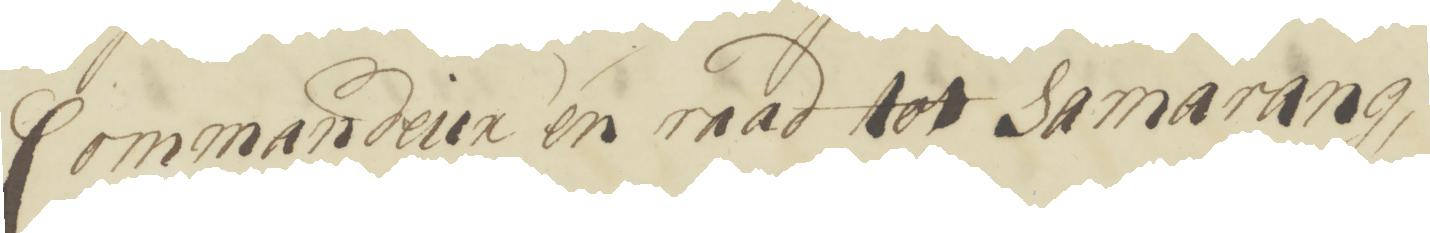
Commandeur en raad tot Samarang,
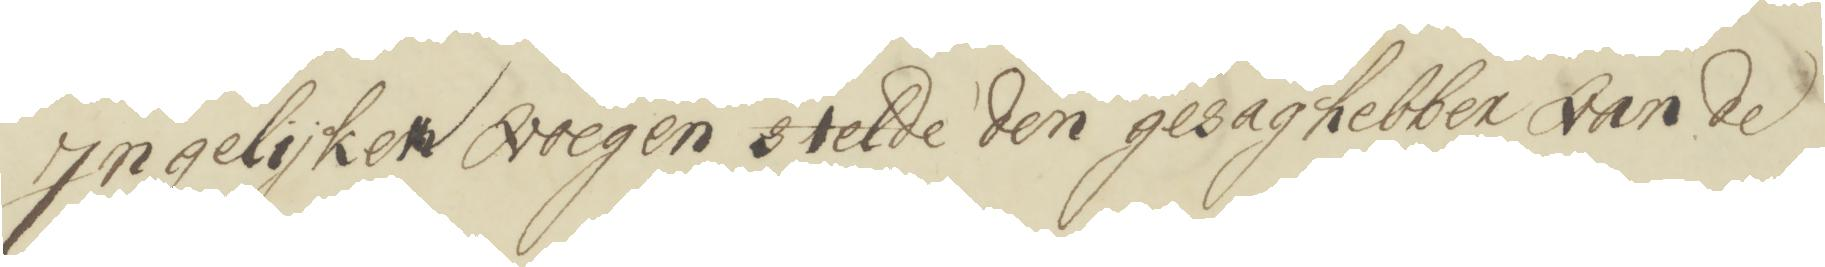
Jngelijken voegen stelde den gesaghebber van de
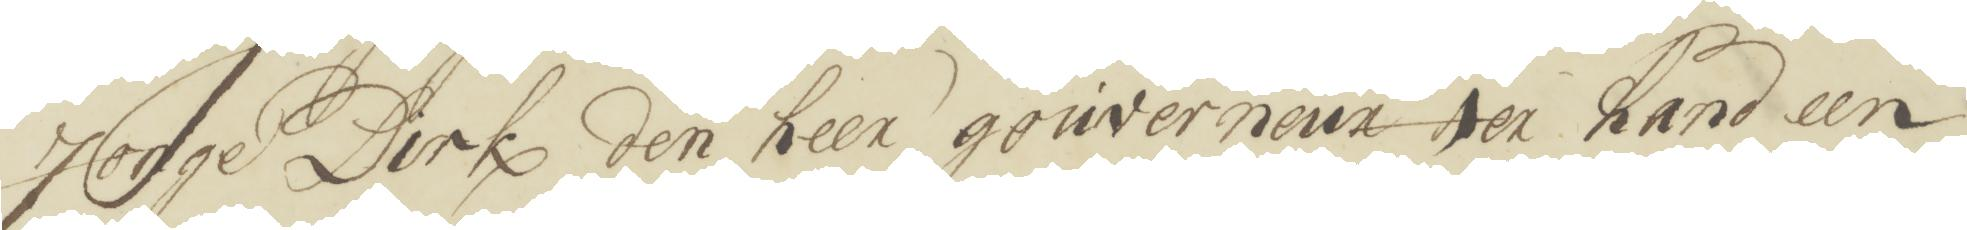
Jonge Dirk den heer gouverneur ter hand een
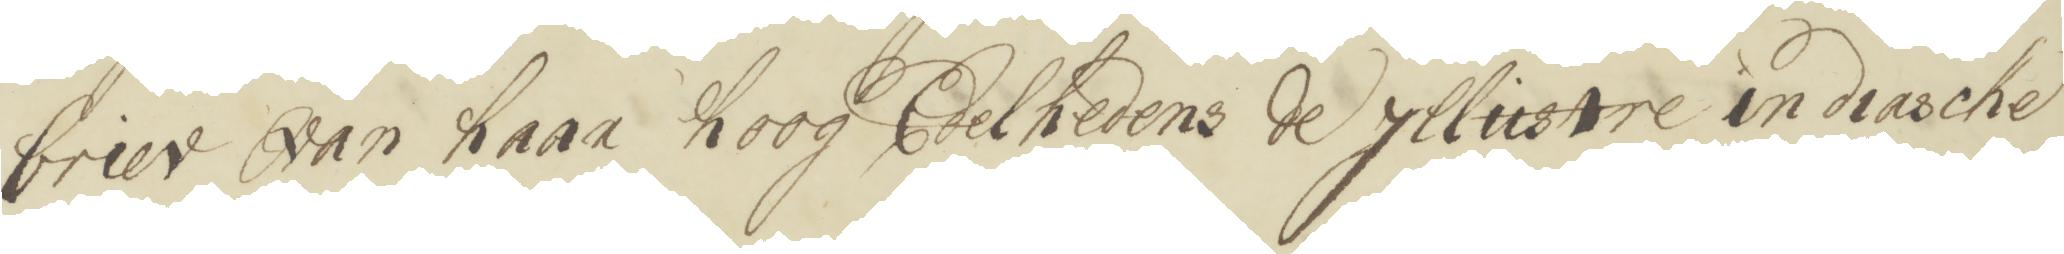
briev van haar hoog Edelhedens de Jllustre indiasche
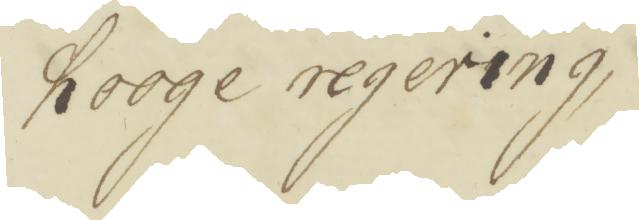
hooge regering,
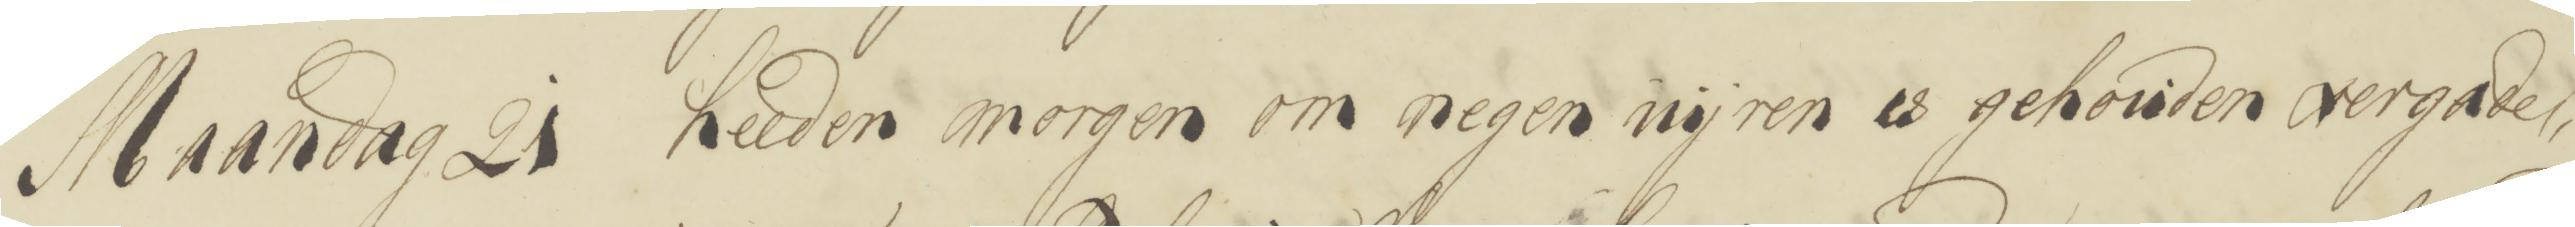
Maandag 21 heeden morgen om negen uijren is gehouden vergade„
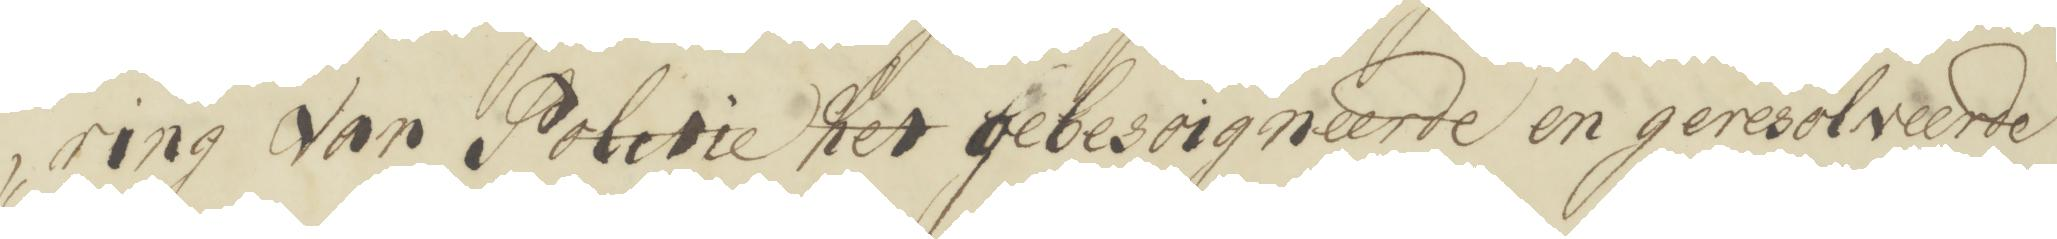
„ring van Politie het gebesoigneerde en geresolveerde
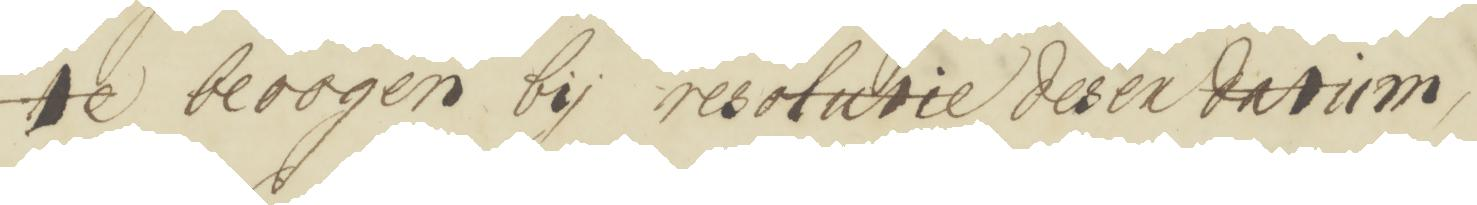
te beoogen bij resolutie deser datum,
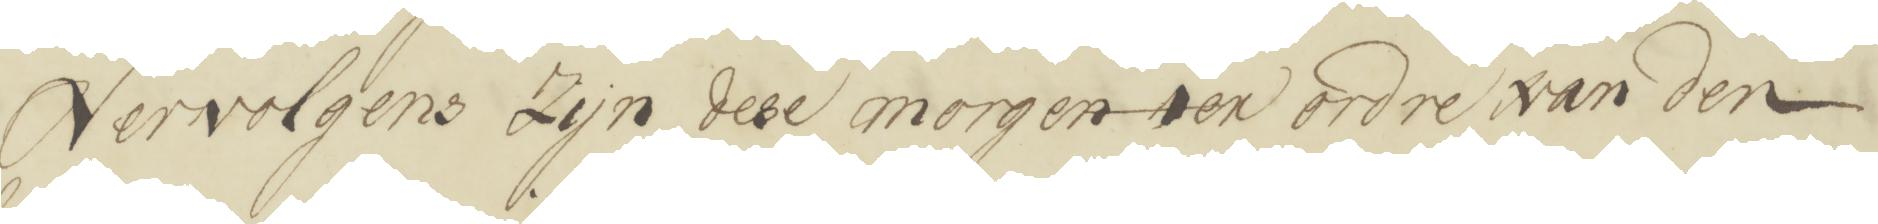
Vervolgens zijn dese morgen der ordre van den
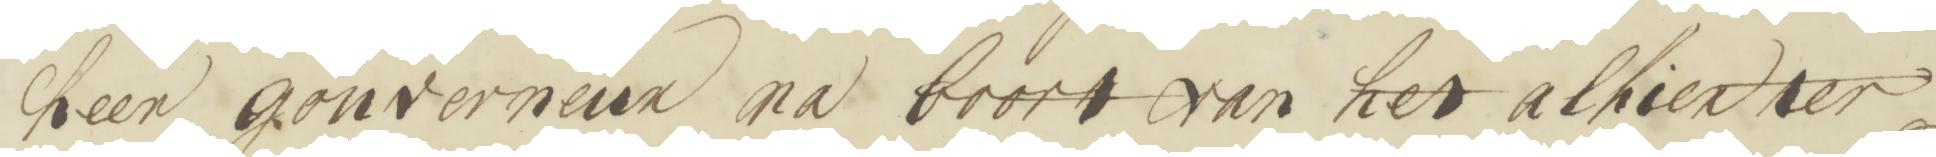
heer gouverneur na boort van het alhier ter
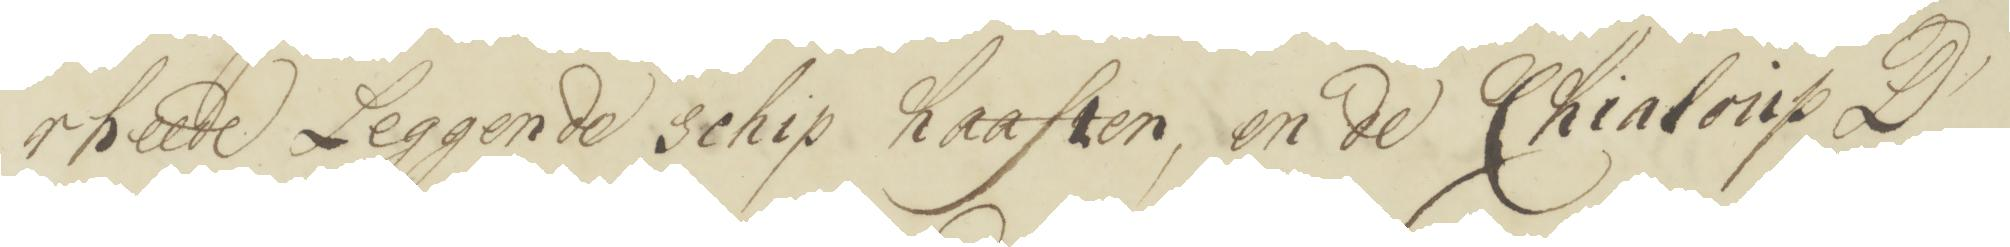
rheede leggende schip haaften, en de Chialoup D'
